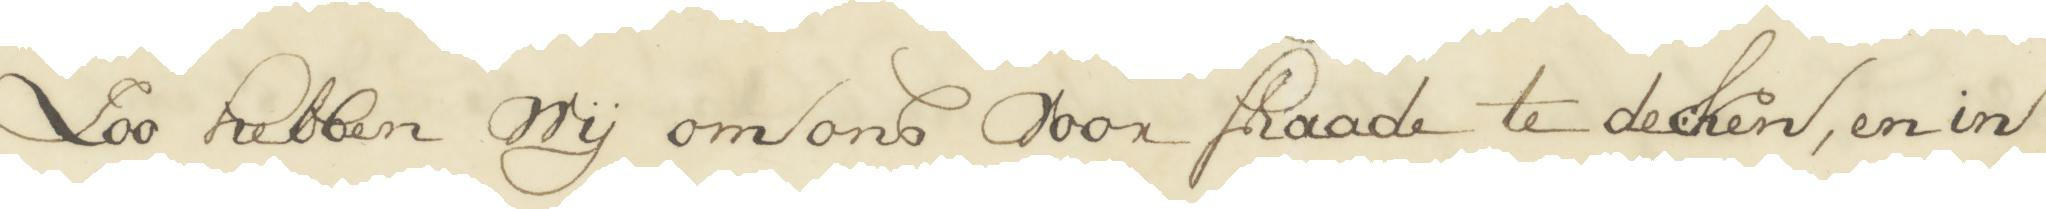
zoo hebben wij om ons voor schaade te decken, en in
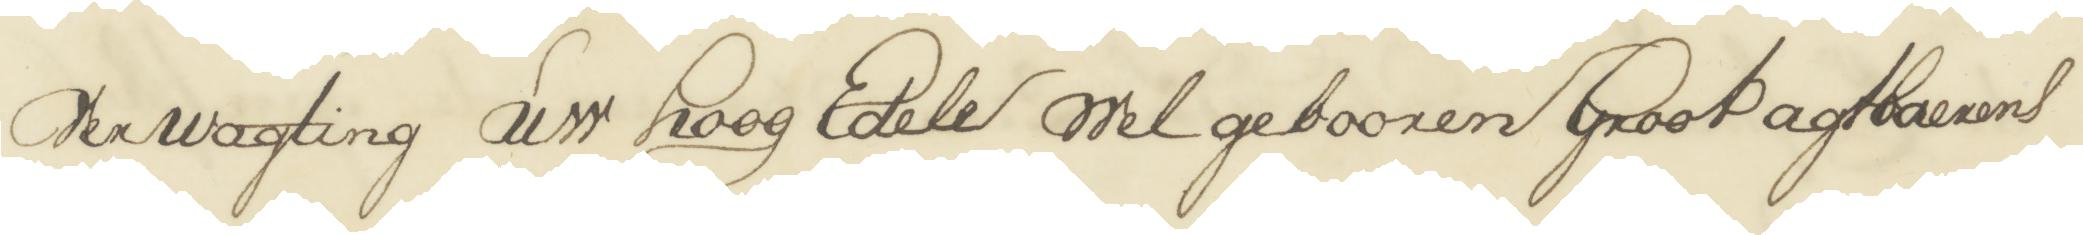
verwagting uw hoog Edele wel gebooren Groot agtbaerens
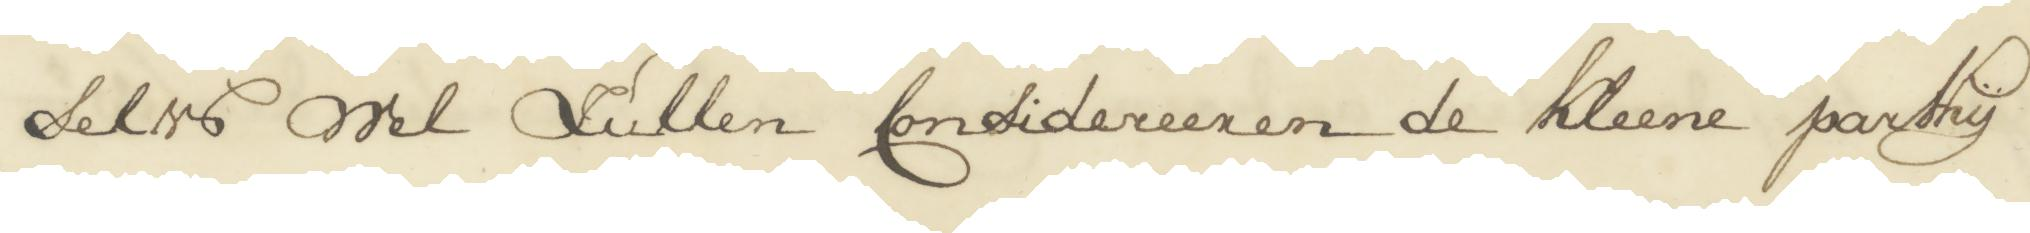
selvs wel zullen considereeren de kleene parthij
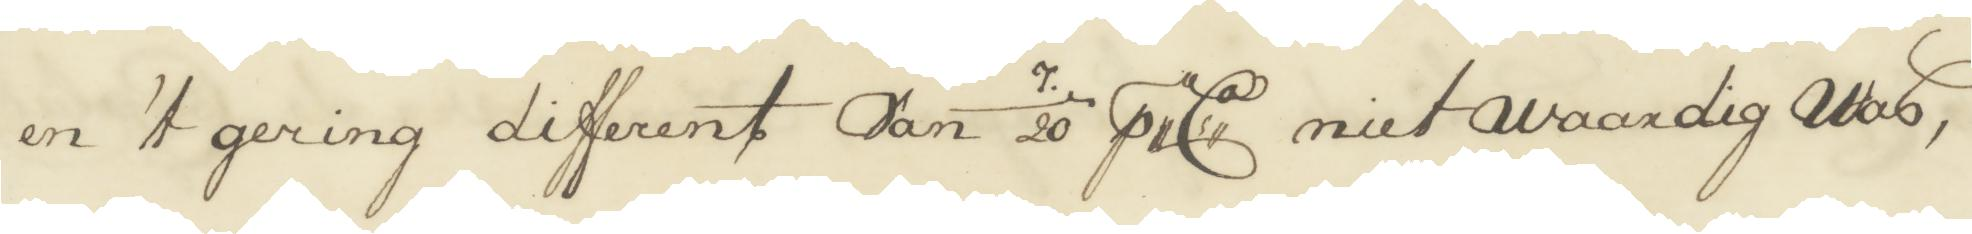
en ’t gering different van 7./20 p„r c„o niet waardig was,
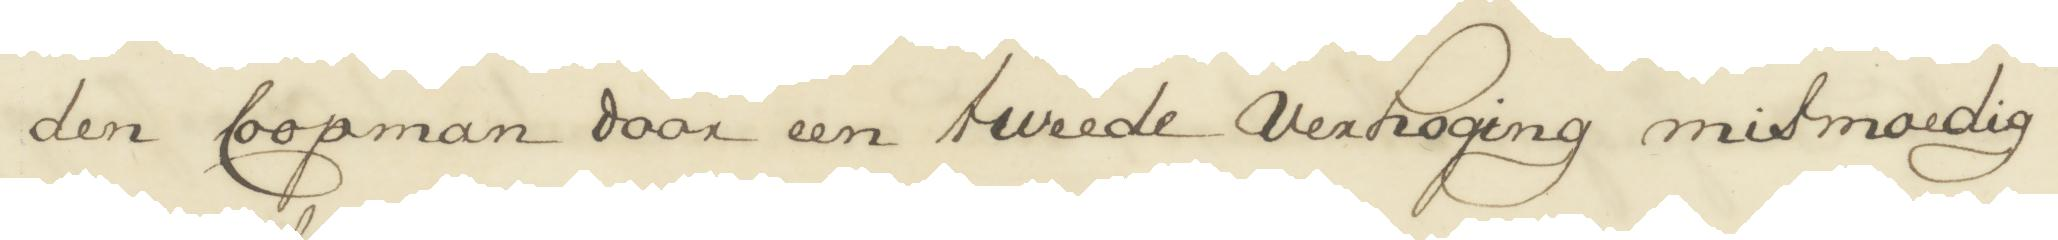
den Coopman door een tweede verhoging mismoedig
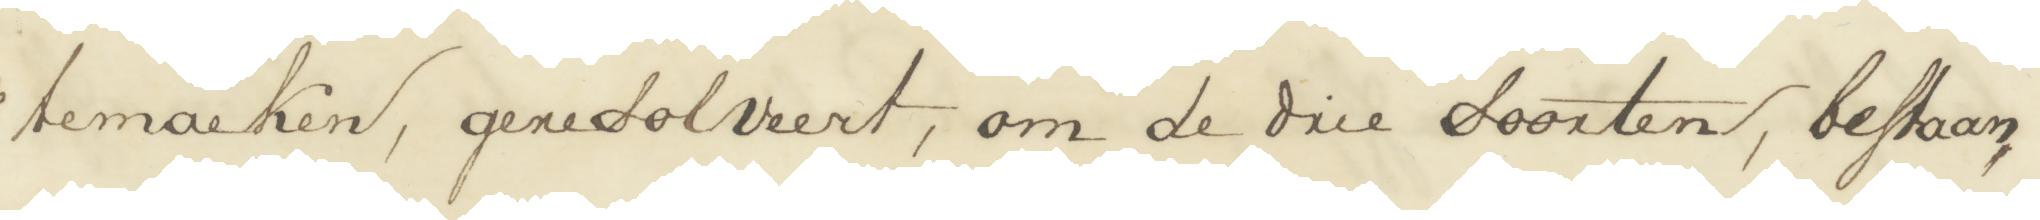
temaeken, geresolveert, om de drie soorten, bestaan„
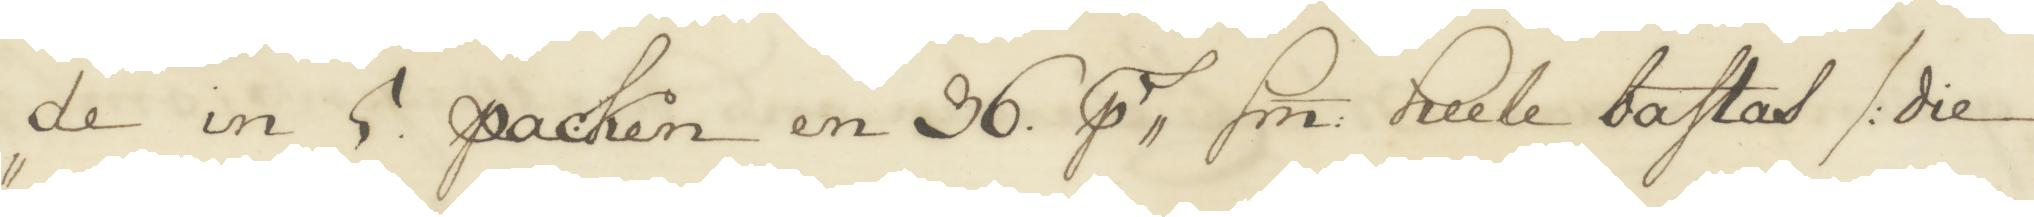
de in 5. packen en 36. p„s sm: heele bastas /: die
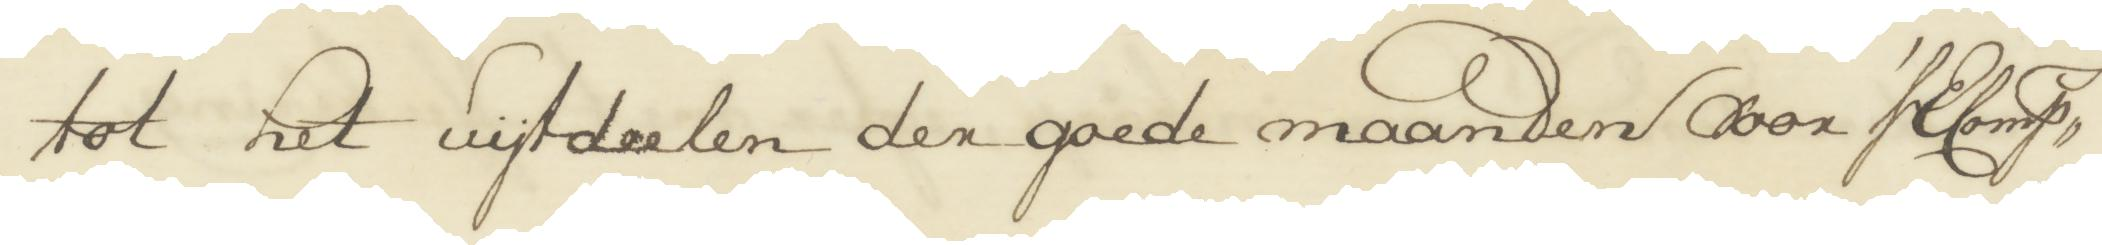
tot het uijtdeelen der goede maanden voor 'sEComp„s
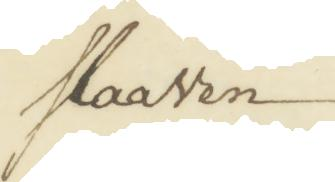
slaaven
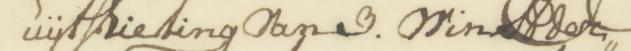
uijtschieting van 3. winstder„
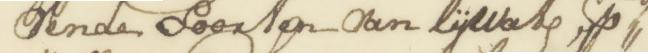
vende soorten van lijwaten p„
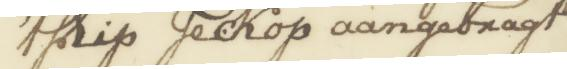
'tschip Teckop aangebragt
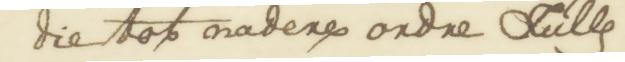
die tot nadere ordre zullen
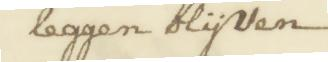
leggen blijven
